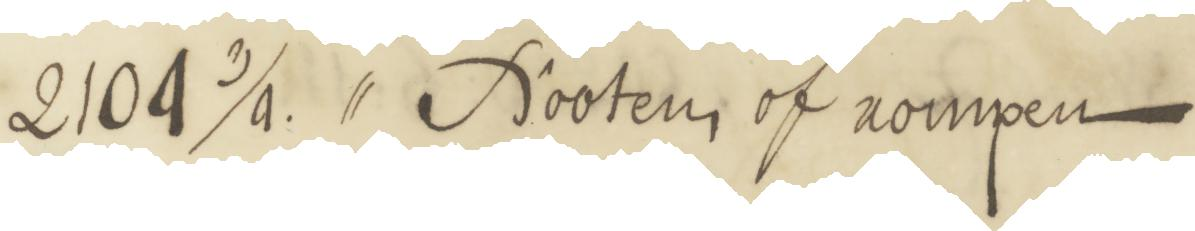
2104¾. „ Nooten of rompen
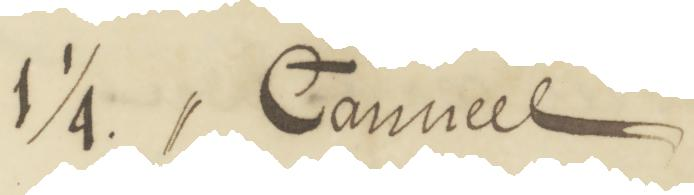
1¼. „ Canneel
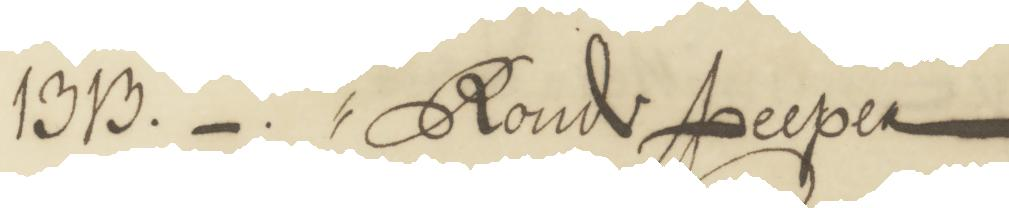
1313.—. „ Ronde peeper
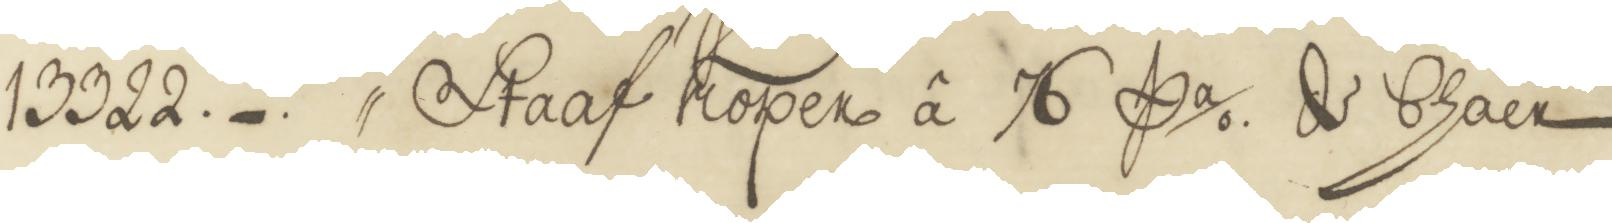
13322.—. „ Staaf koper â 76 p a/o. de bhaer
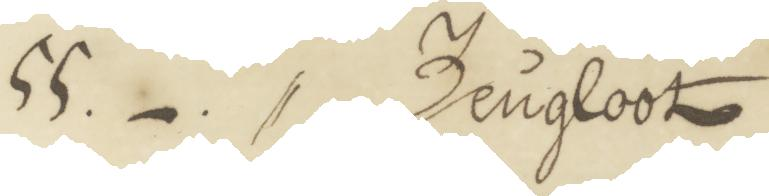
55.—. „ Zeugloot
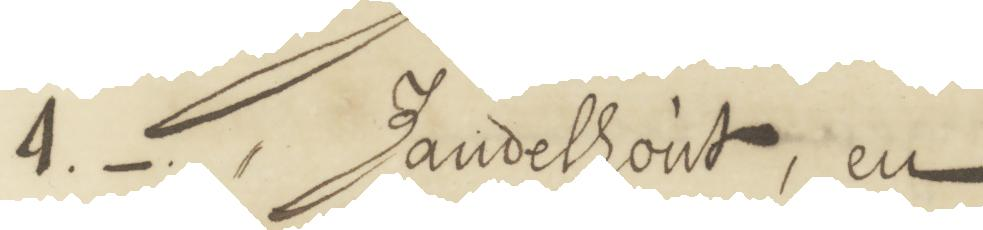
4.—. „ Zandelhout, en
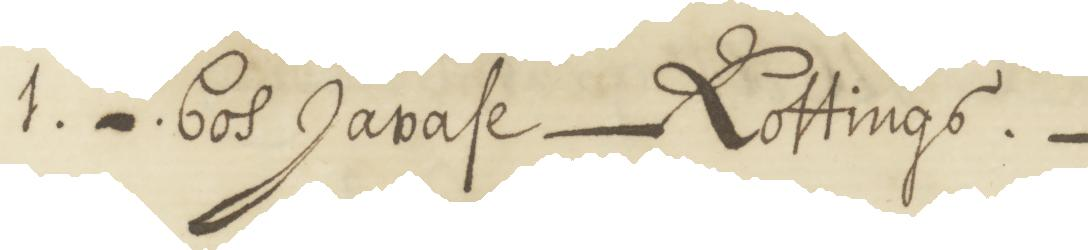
1.—. bos Javase Rottings.
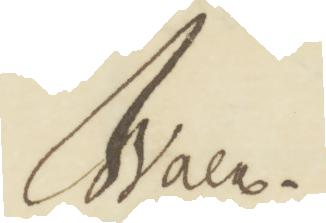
Waer.
